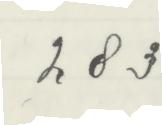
283
